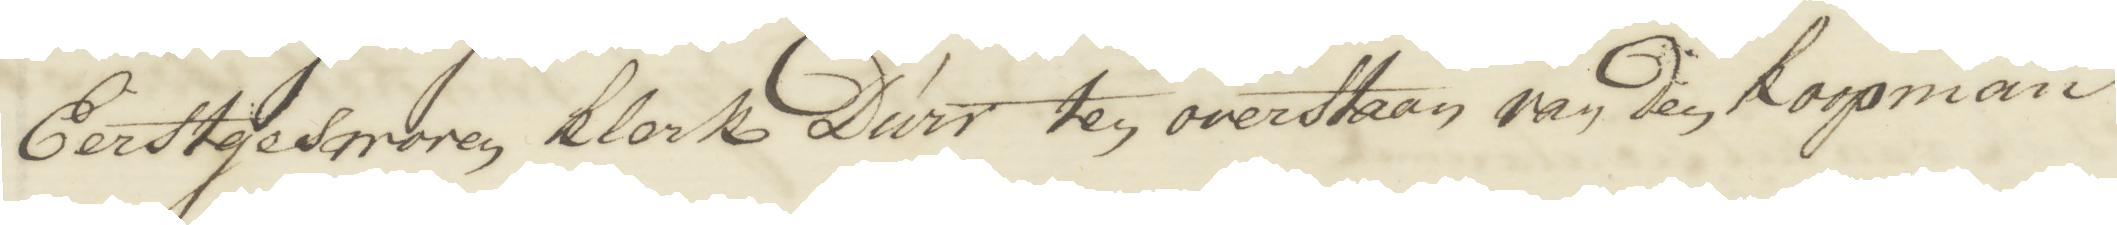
Eerstgesworen klerk Durr ten overstaan van den koopman
